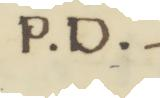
P. D.
